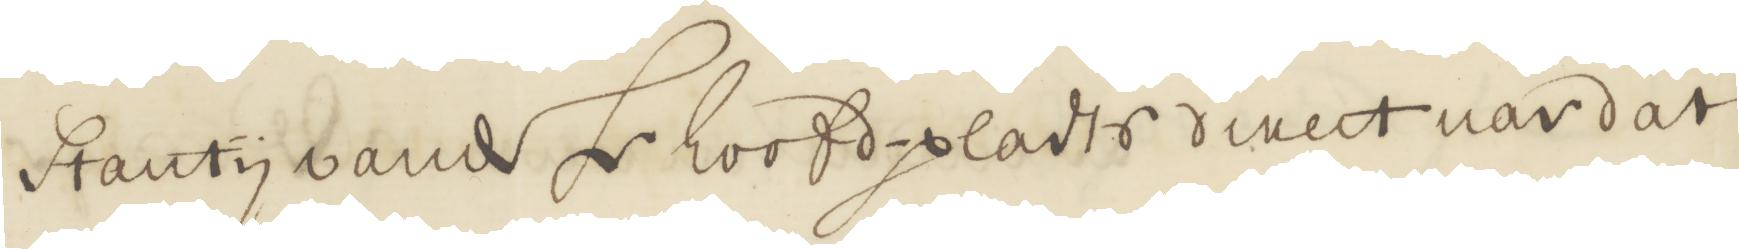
stantij van dese hoofd-plaets direct nae dat
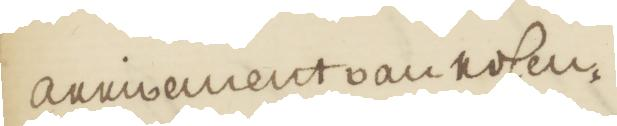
arrivement van rosen„
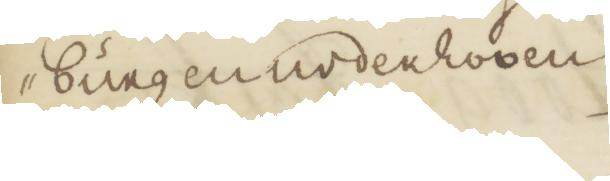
burg en nederhoven
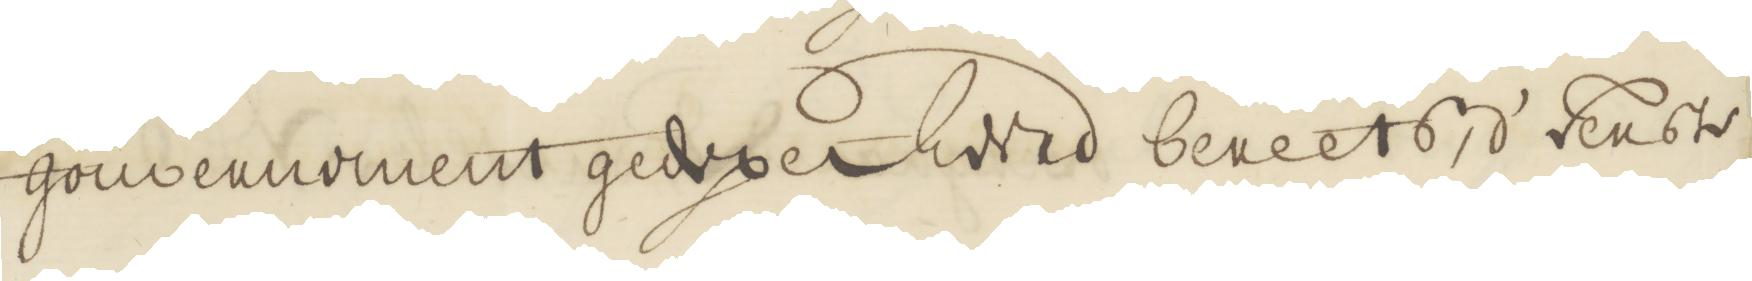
gouvernement gedepecheerd bereets, d’ Eerste
